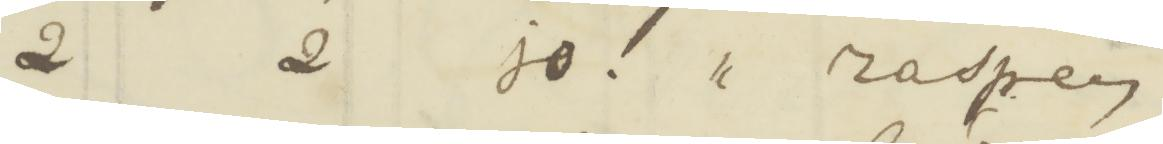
2 2 10. „ raspen
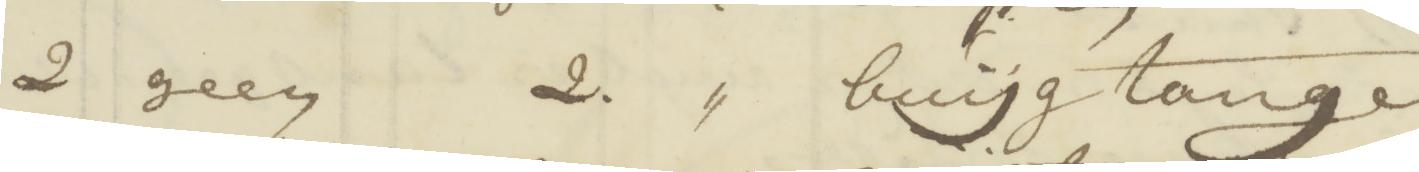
2 geen 2. „ buijg tange
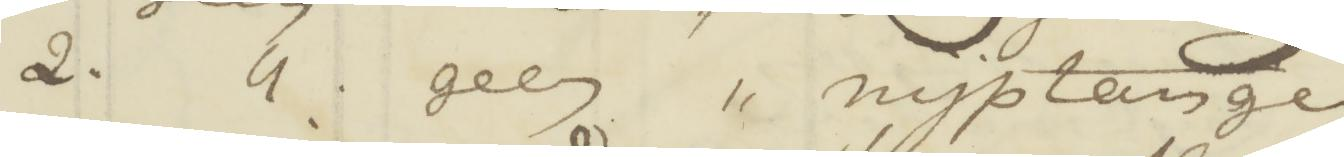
2. 4. geen „ nijptangen
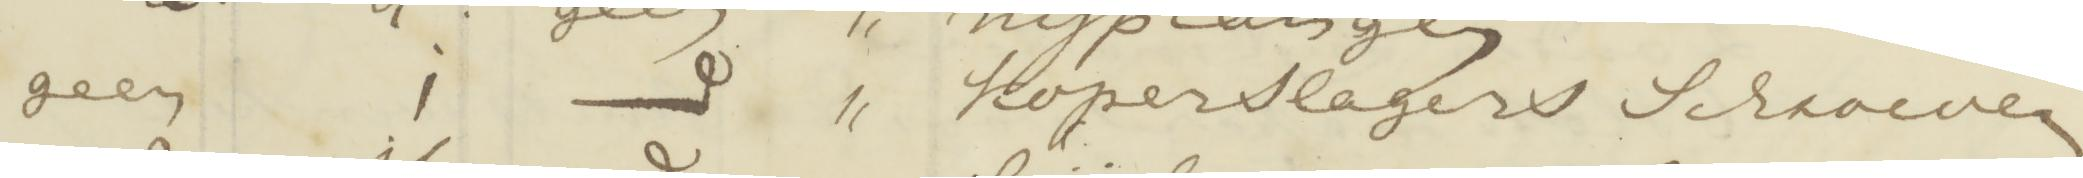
geen 1 _o „ koperslagers schroeven
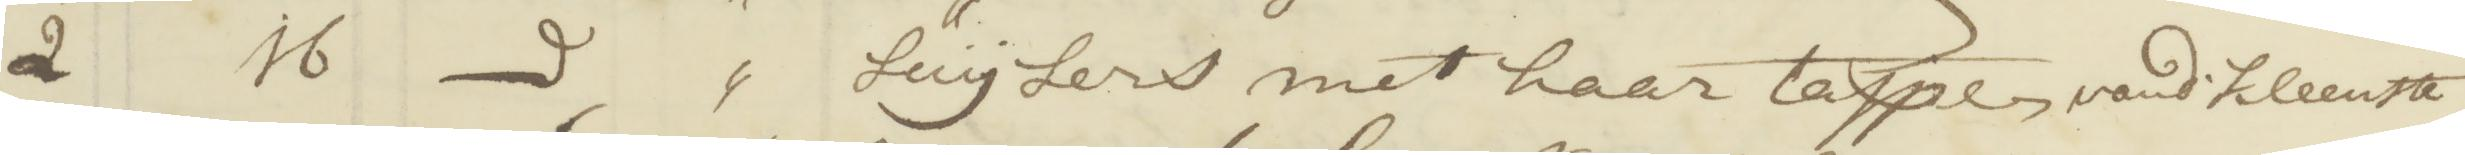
2 16 _o „ suijsers met haar tappen van d’kleenste
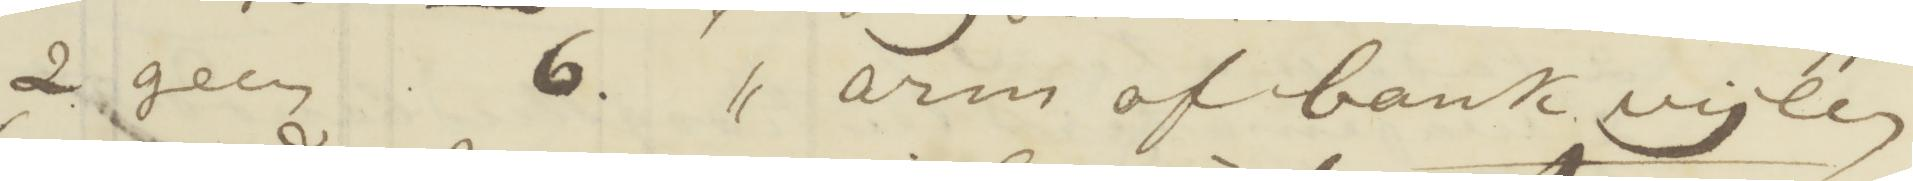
2. geen 6. „ arm of bank vijlen
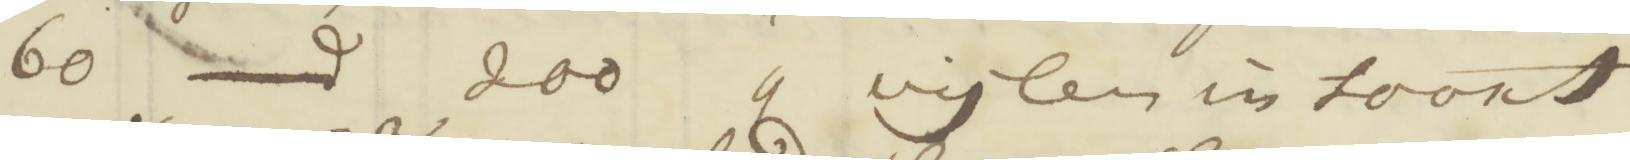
60 _o 200 „ vijlen in soort
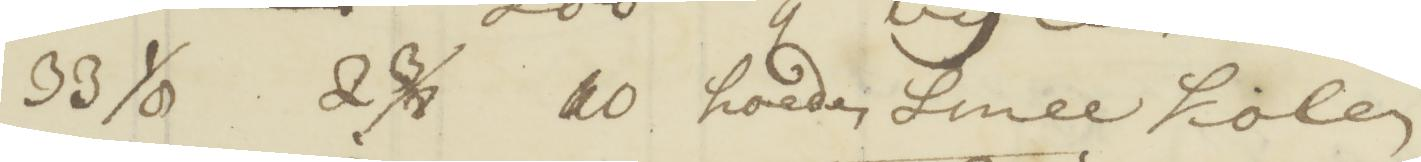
33 1/8 2 3/8 40 hoeden smee kolen
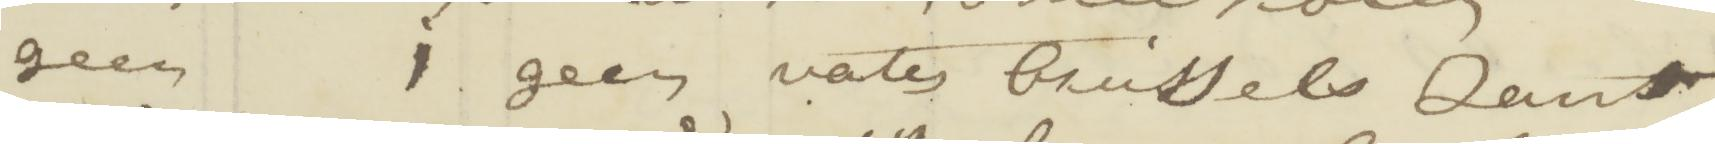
geen 1. geen vaten brussels zant
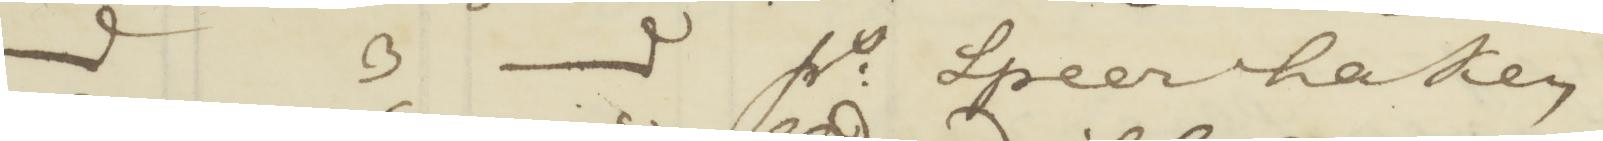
_o 3 _o p:s speerhaken
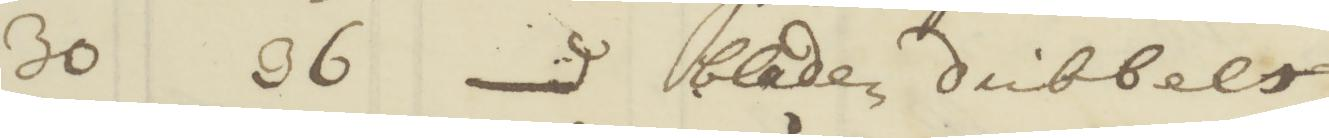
30 36 _o bladen dubbelt
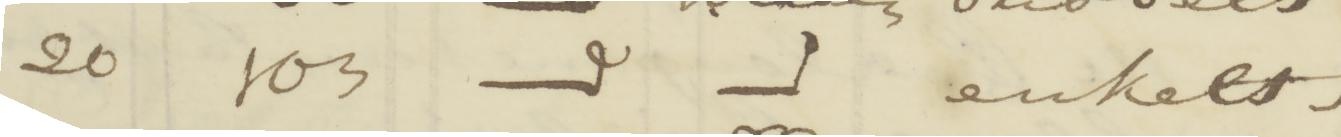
20 103 _o _o enkelt
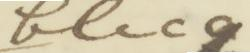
blicq
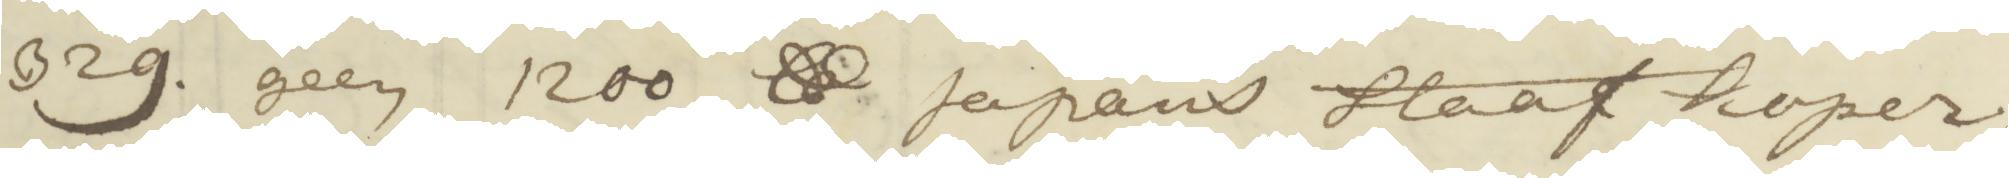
329. geen 1200 lb japans staaf koper
